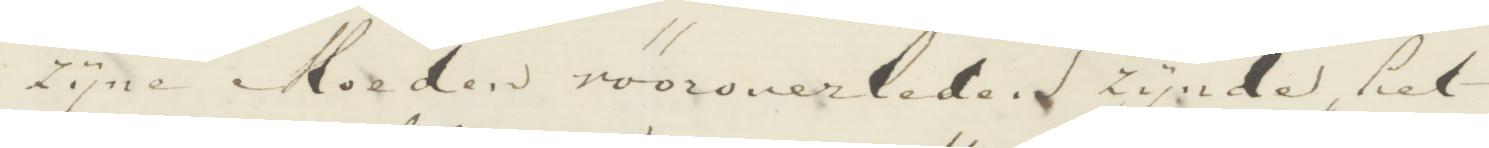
zijne Moeder vóóroverleden zijnde, het
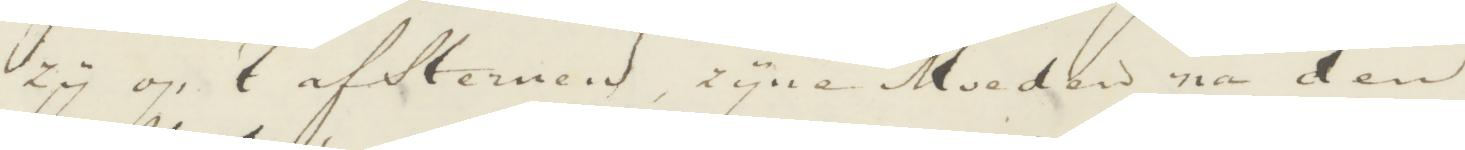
zij op ’t afsterven, zijne Moeder na den
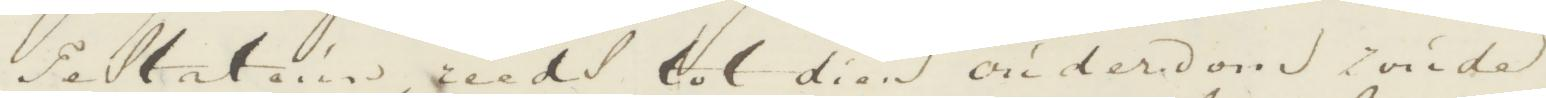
Testateur, reeds tot dien onderdom zoude
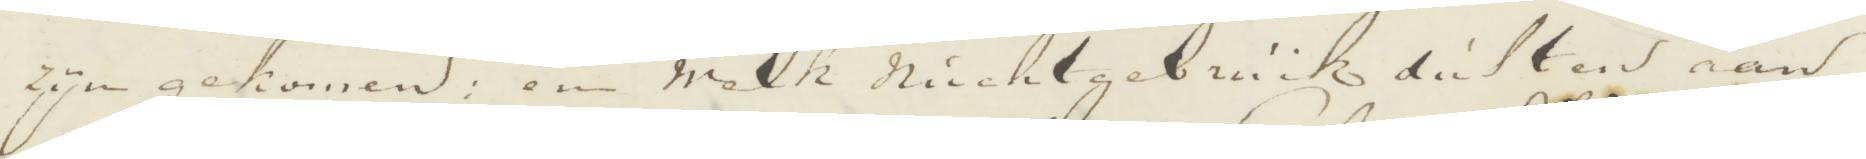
zijn gekomen: en welk vruchtgebruik dus ten aan
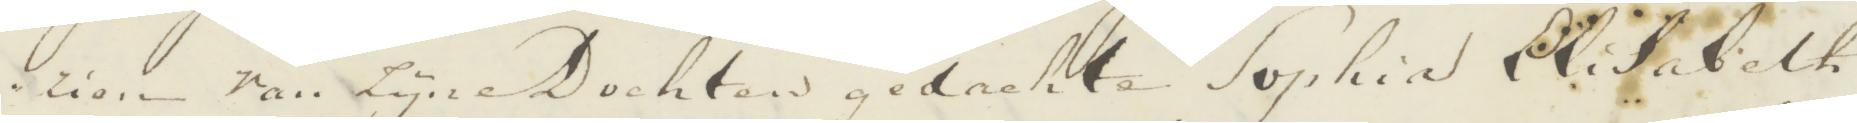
=zien van zijne Dochter gedachte Sophia Elisabeth
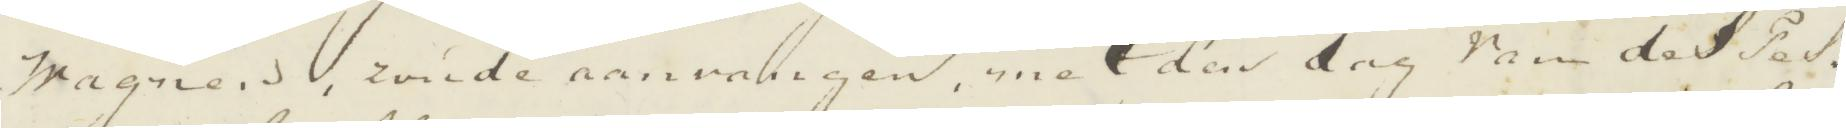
Wagner, zoude aanvangen, met den dag van des Tes„
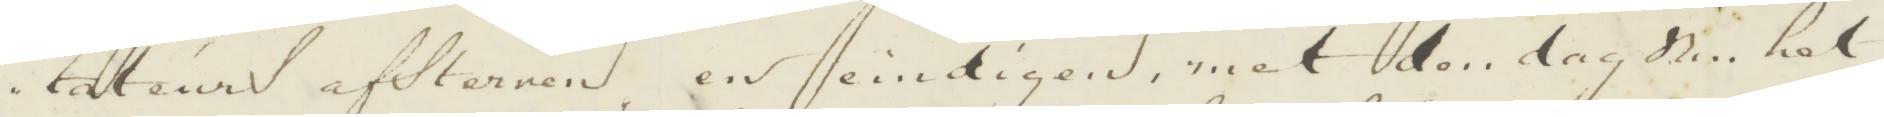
„tateurs afsterven, en eindigen, met den dag van het
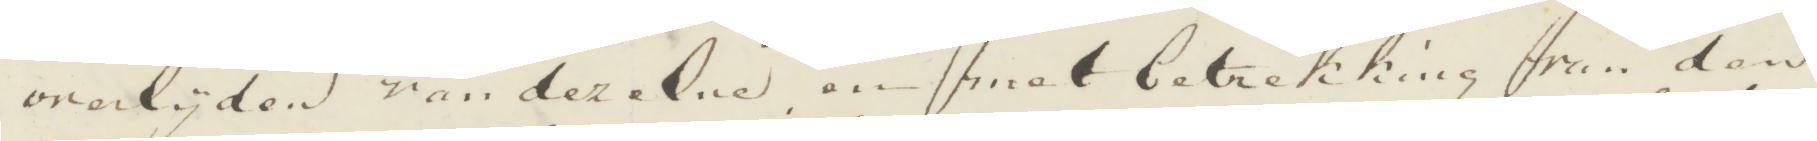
overlijden van dezelve en met betrekking van den
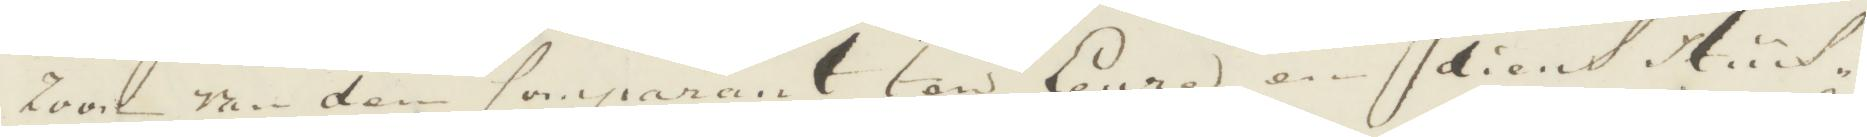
zoon van den Comparant ten Eenre en diens Huis„
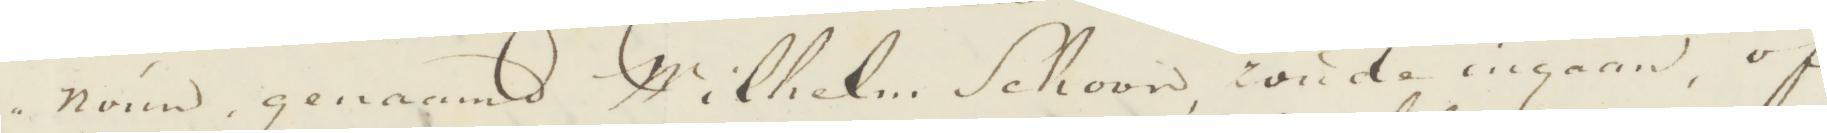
„vrouw, genaamd Wilhelm Schoon zoude ingaan, of
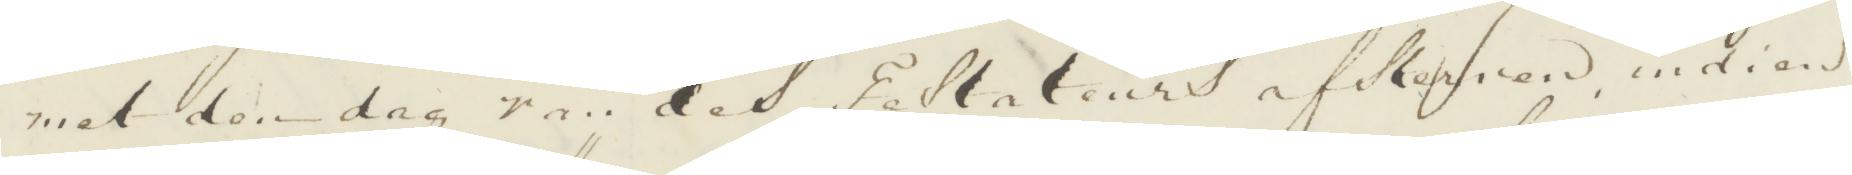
met den dag van des Testateurs afsterven, indien
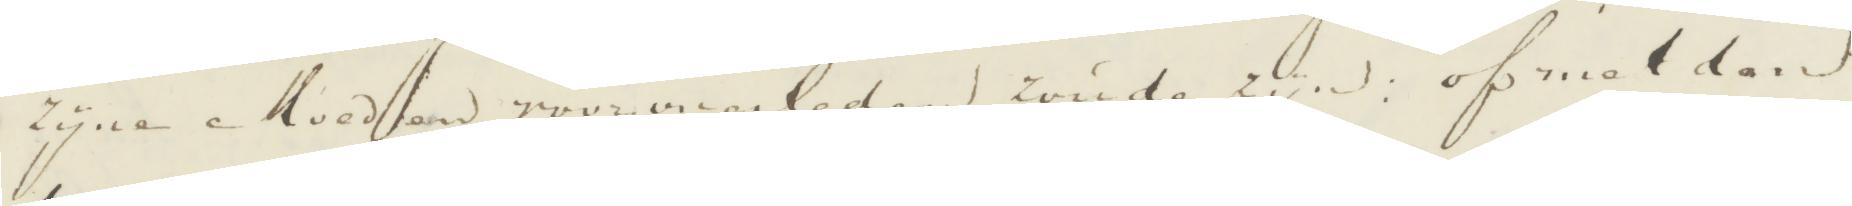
zijne Moeder vóór overleden zoude zijn; of met den
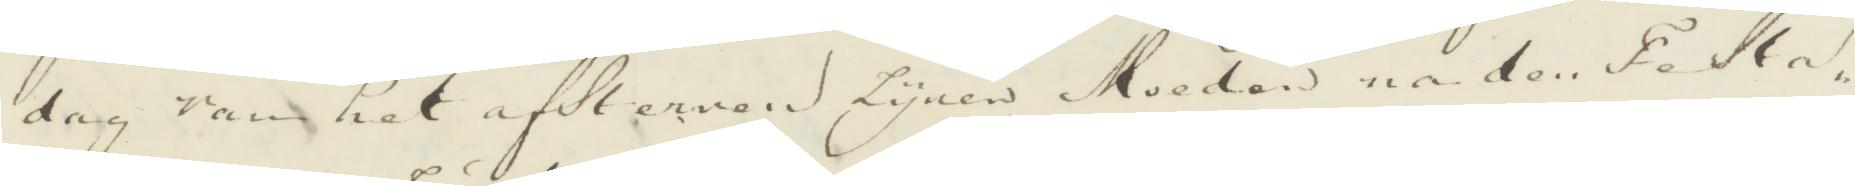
dag van het afsterven zijner Moeder na den Testa„
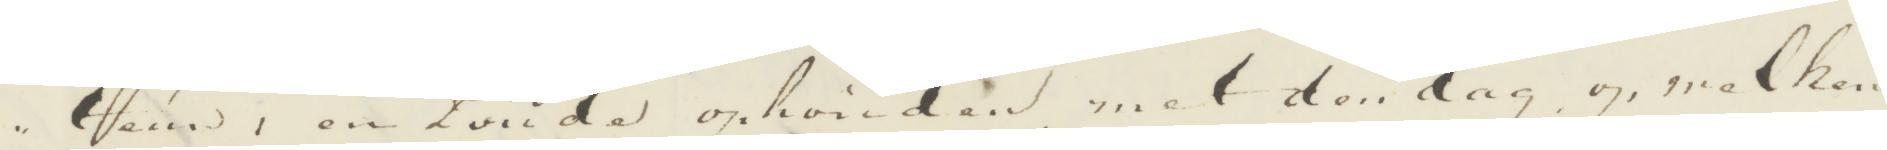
„teur, en zoude ophouden met den dag, op welken
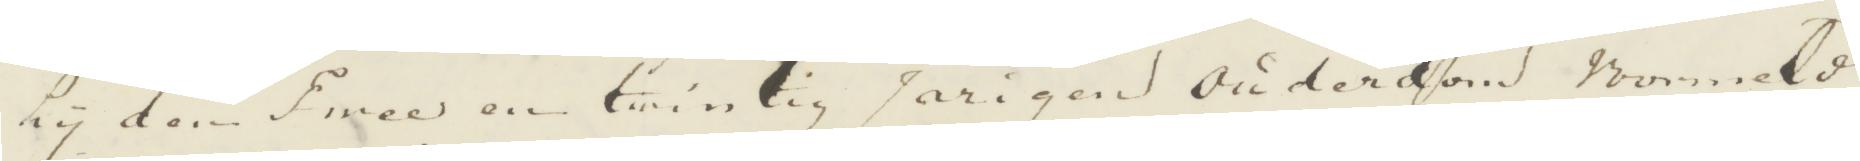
hij den Twee en twintig jarigen ouderdom voormeld
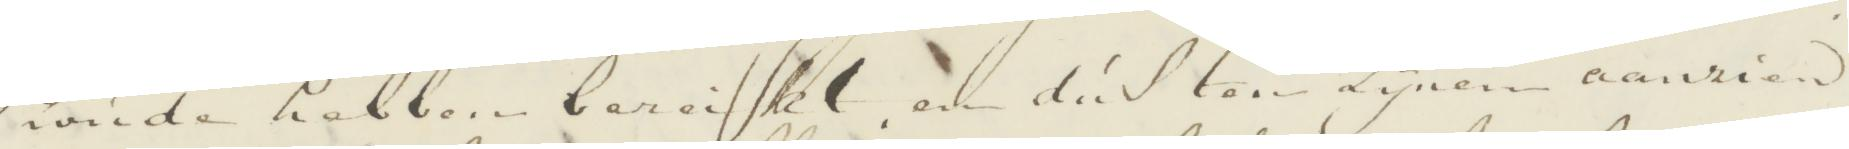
zoude hebben bereikt, en dus ten zijnen aanzien
